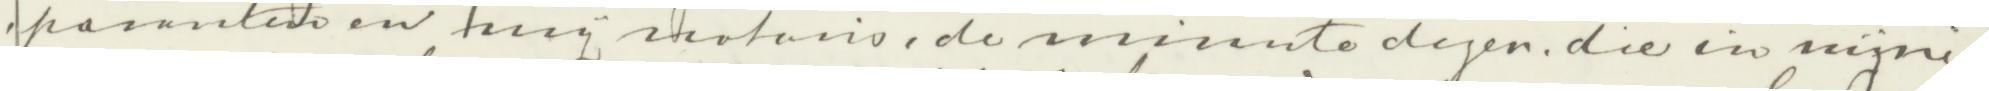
„paranten en mij notaris, de minute dezen, die in mijne
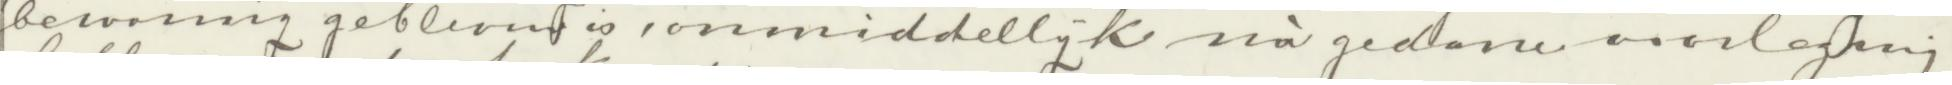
bewaring gebleven is, onmiddellijk na gedane voorlezing
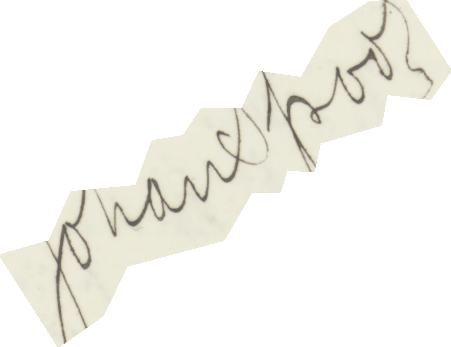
JohanSpook
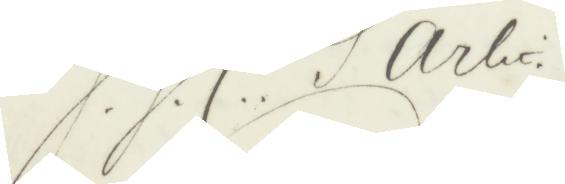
J.J.C.. Sarlet
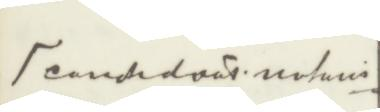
¶candidaat-notaris
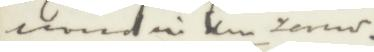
woord in den zeven
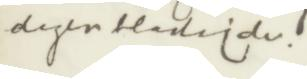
dezer bladzijde
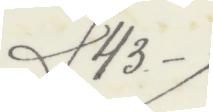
ƒ43.-
